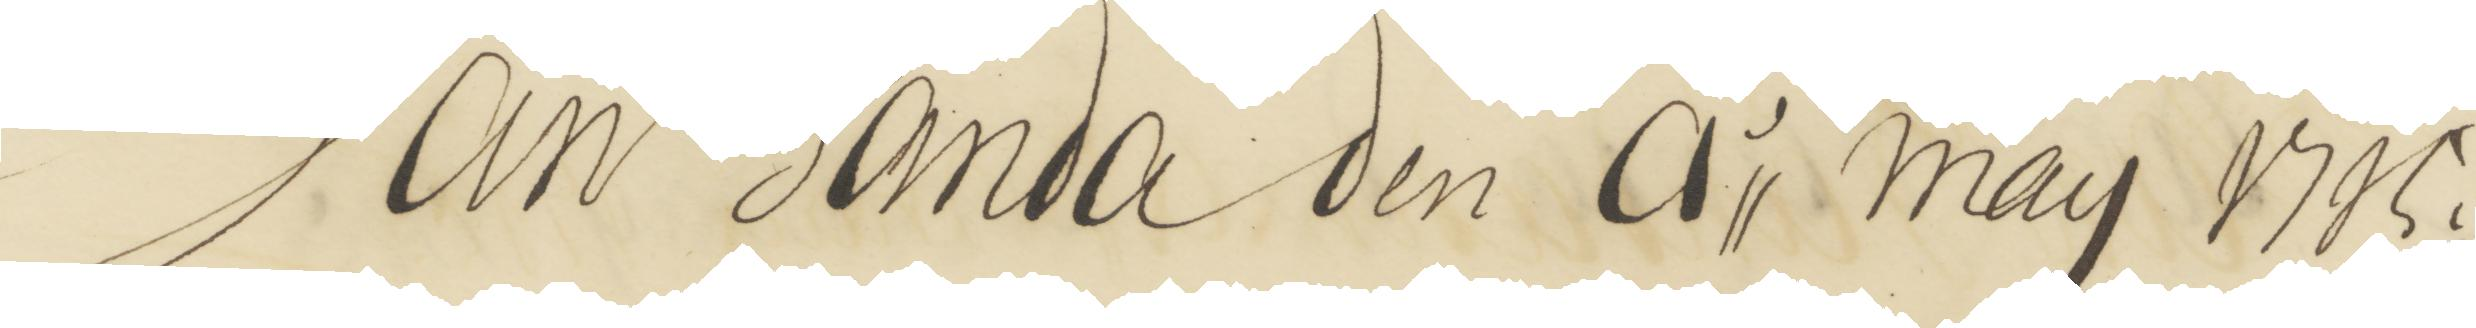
Van Banda den 4„' Maij 1715.
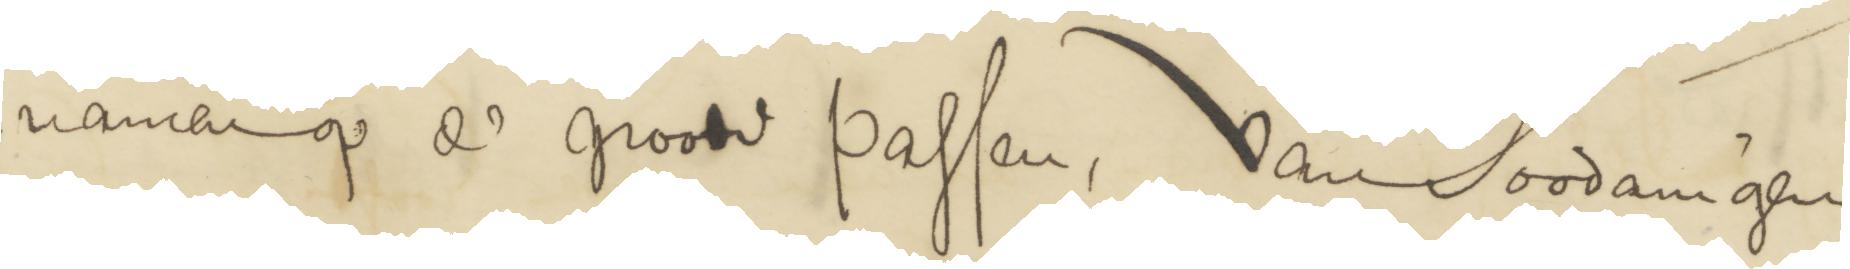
namen op de groote passen, van soodanigen
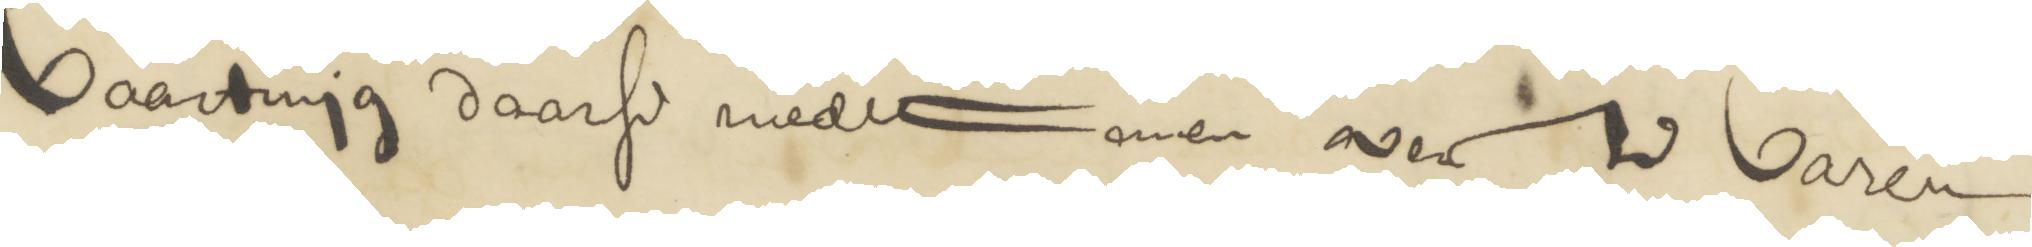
vaartuijg daarse medecomen over te varen
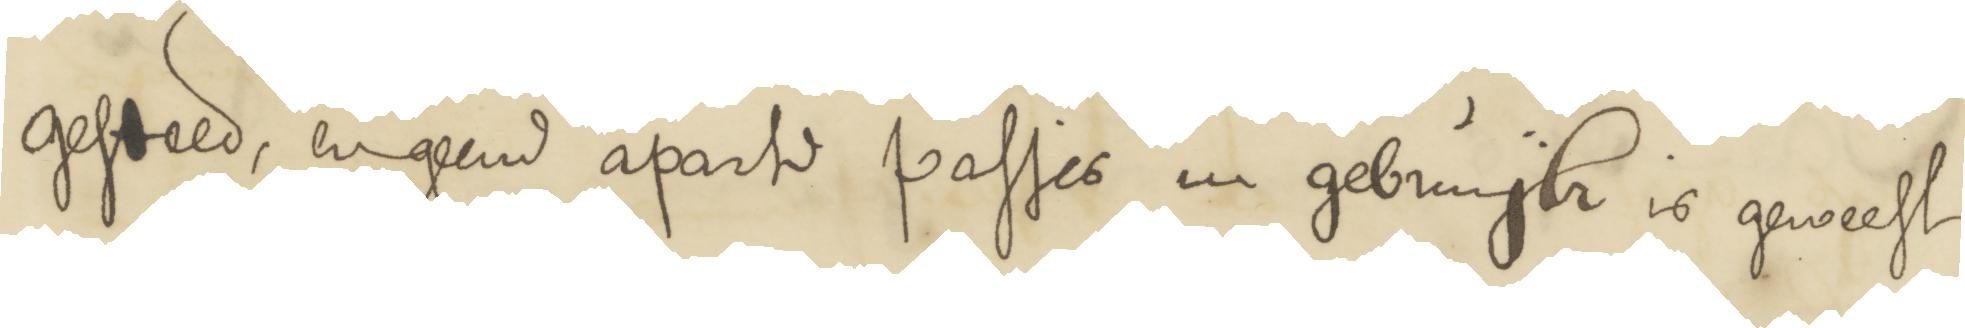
gesteld, en geene aparte pasjes in gebruijk is geweest
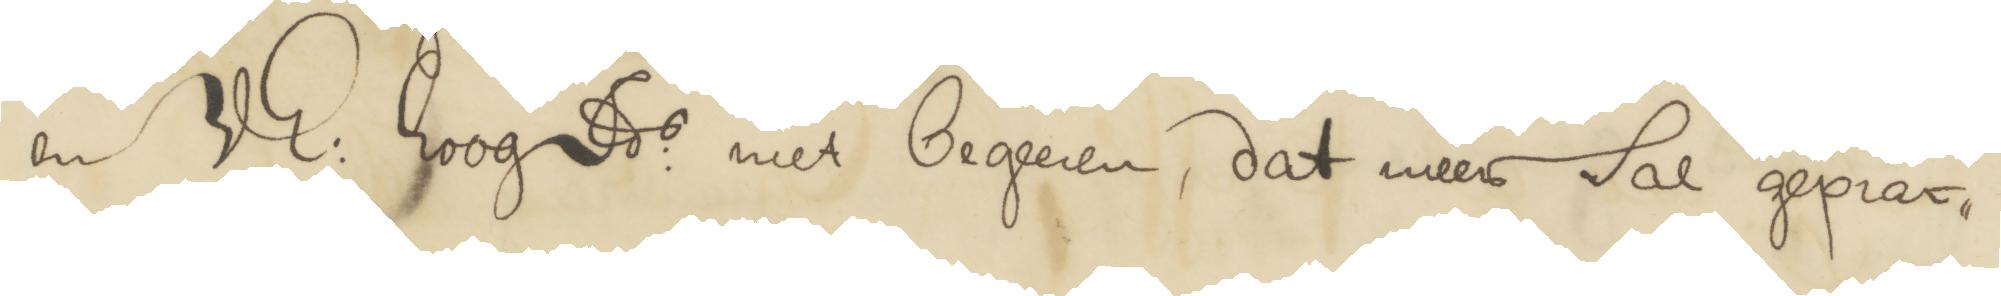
en VE: hoog Ed:s niet begeeren, dat meer sal geprac„
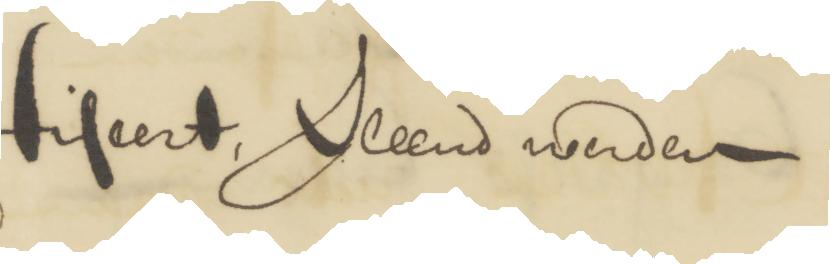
tiseert, verleend werden
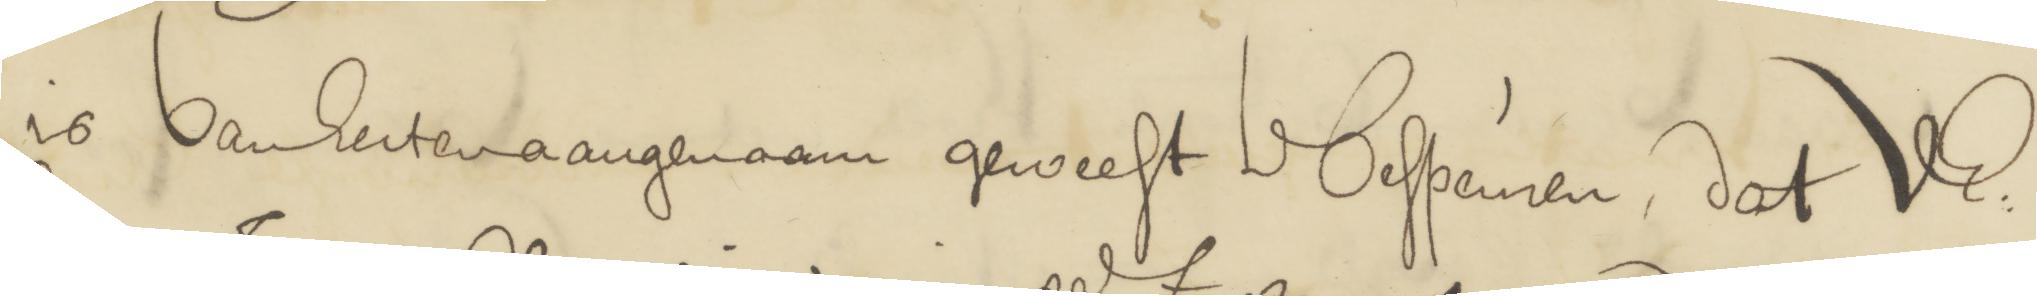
is van herten aangenaam geweest te bespeuren, dat VE:
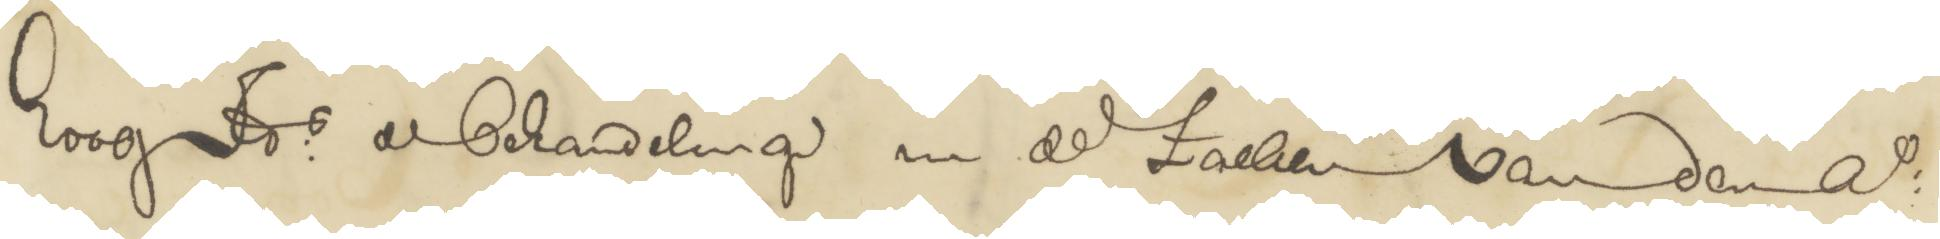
hoog Ed:s de behandelinge in de zaeken van den a:o
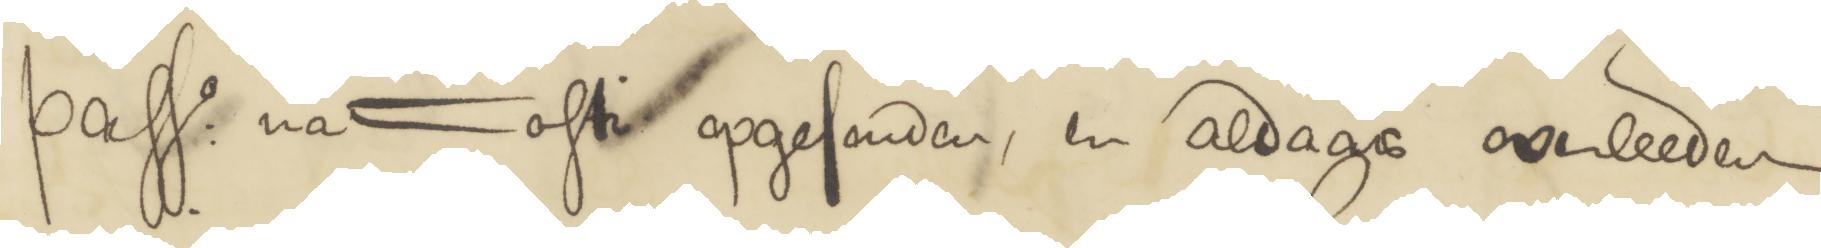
pass:o na Costi opgesonden, en aldaar overleeden
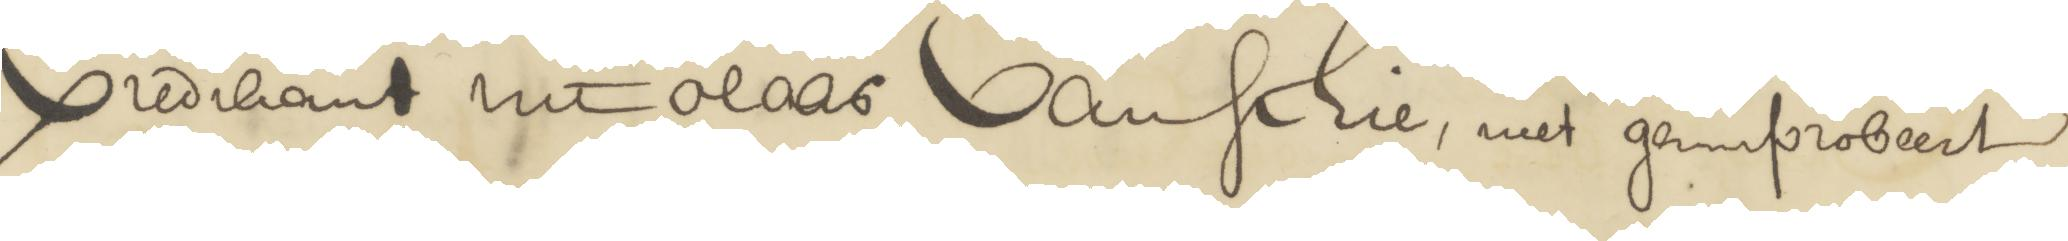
predikant nicolaas van schie, niet geimprobeert
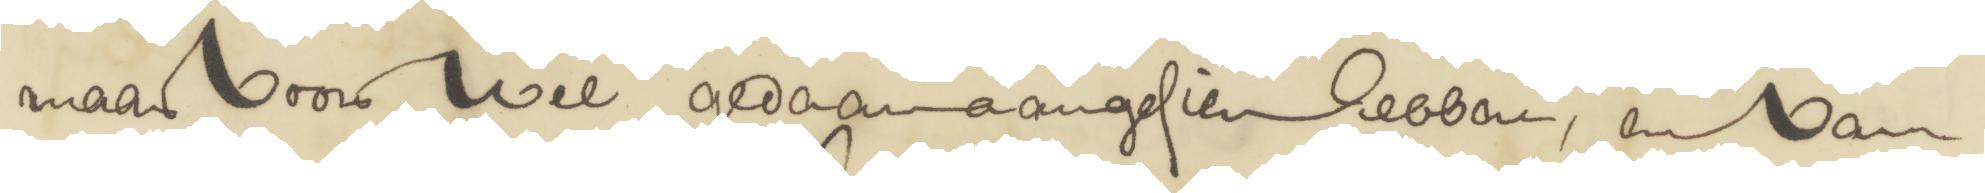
maar voor wel gedaan aangesien hebben, en van
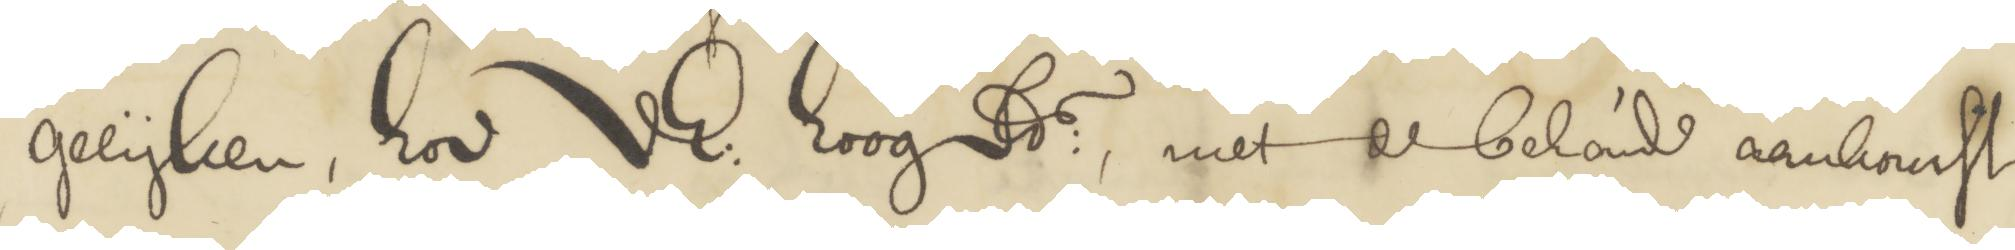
gelijken, hoe VE: hoog Ed:s, met de behoude aankomst
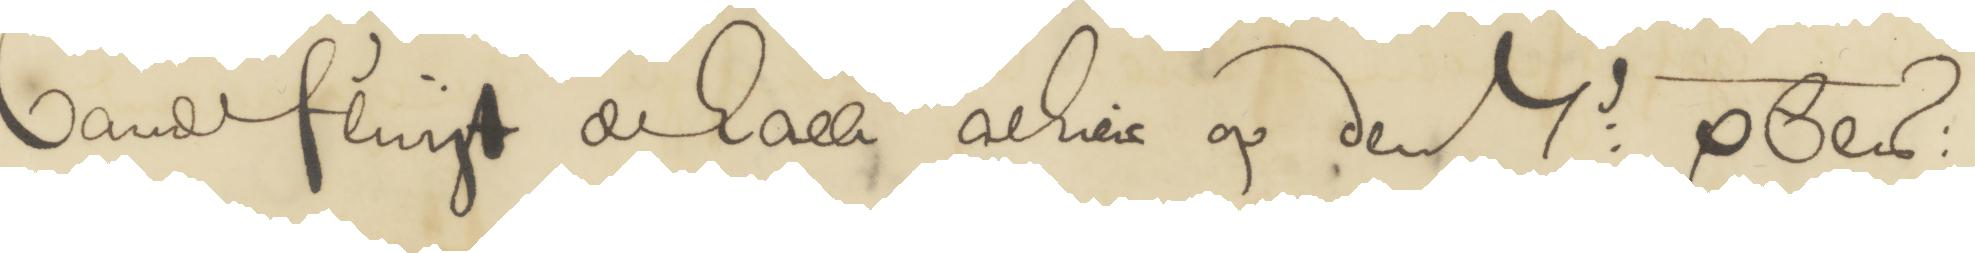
vande fluijt de halk alhier op den 7:' xber:
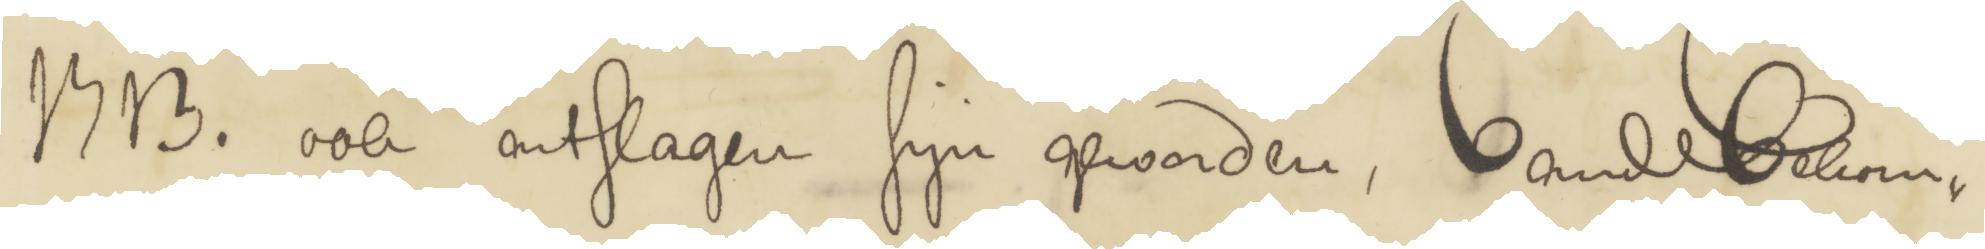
1713. ook ontslagen sijn geworden, van de bekom„
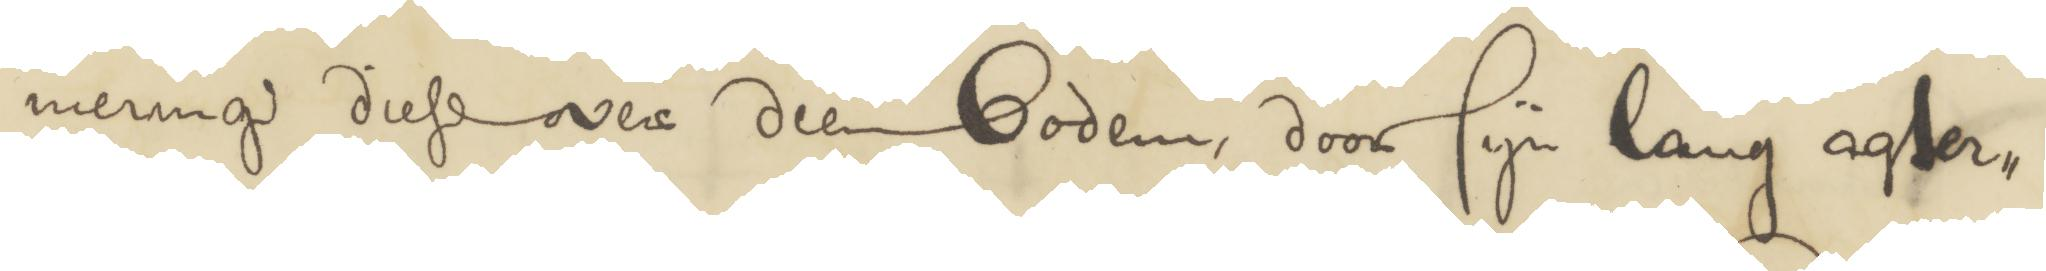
meringe diese over die bodem, door sijn lang agter„
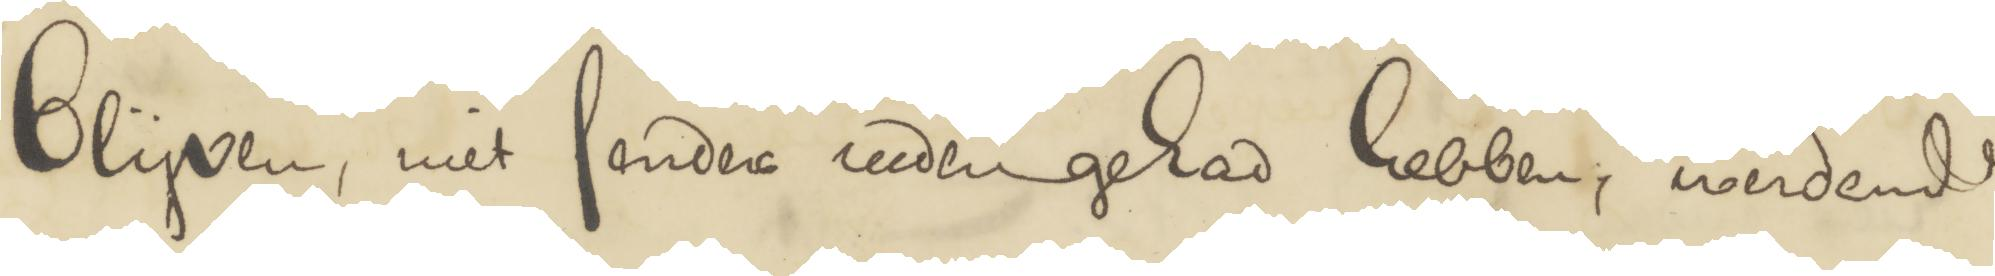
blijven, niet sonder reeden gehad hebben, werdende
